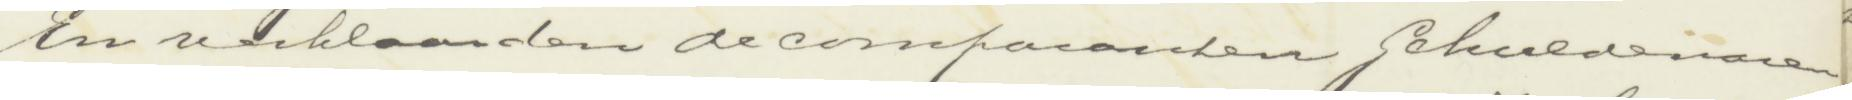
En verklaarden de comparanten Schuldenaren
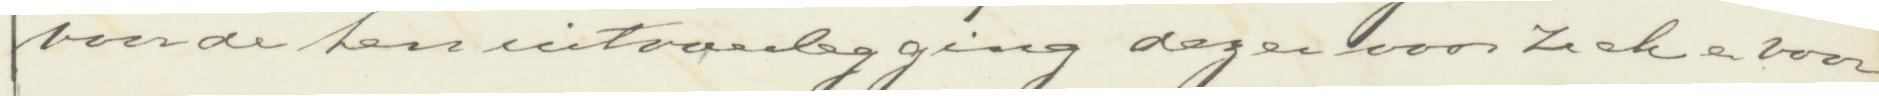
voor de ten uitvoerlegging dezer voor zich en voor
